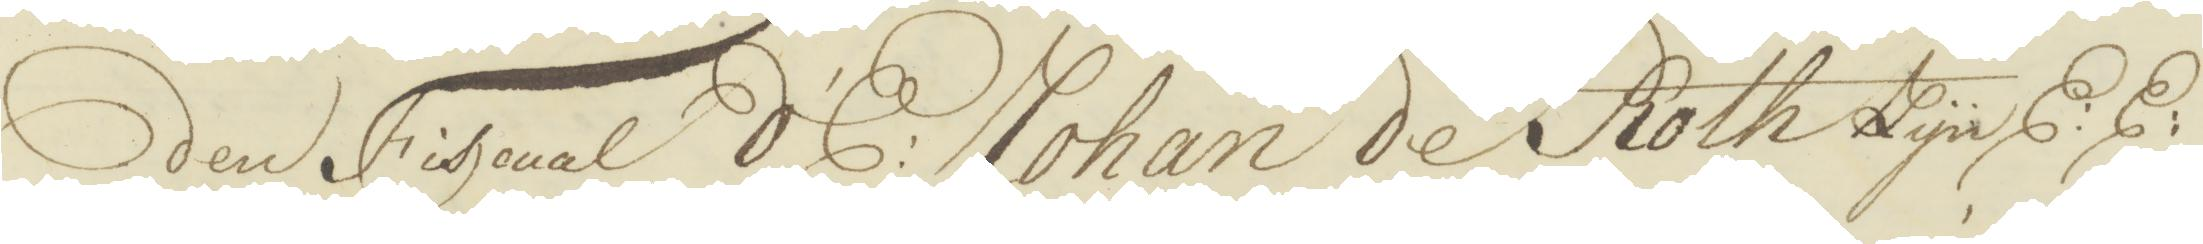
den Fiscaal d’ E: Johan de Roth zijn E: E:
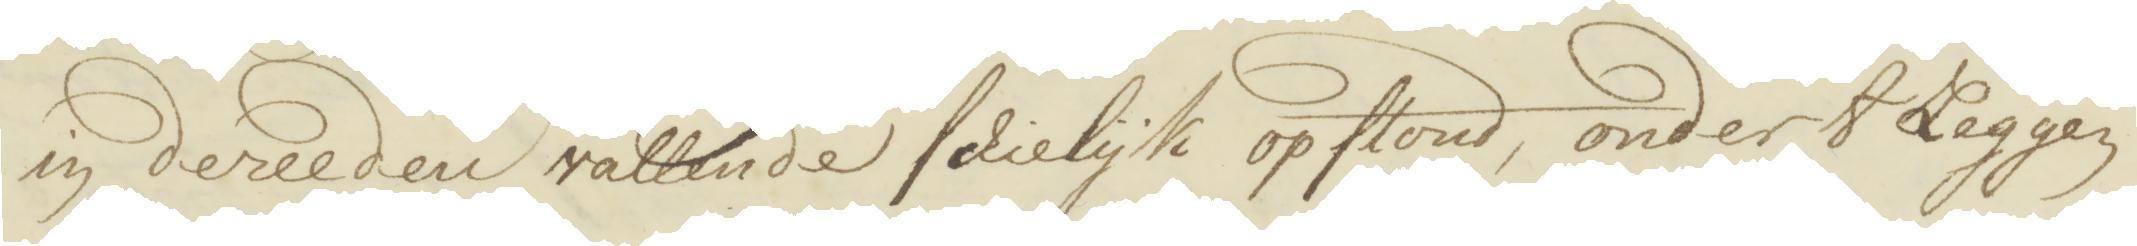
in dereeden vallende schielijk op stond, onder 't zeggen
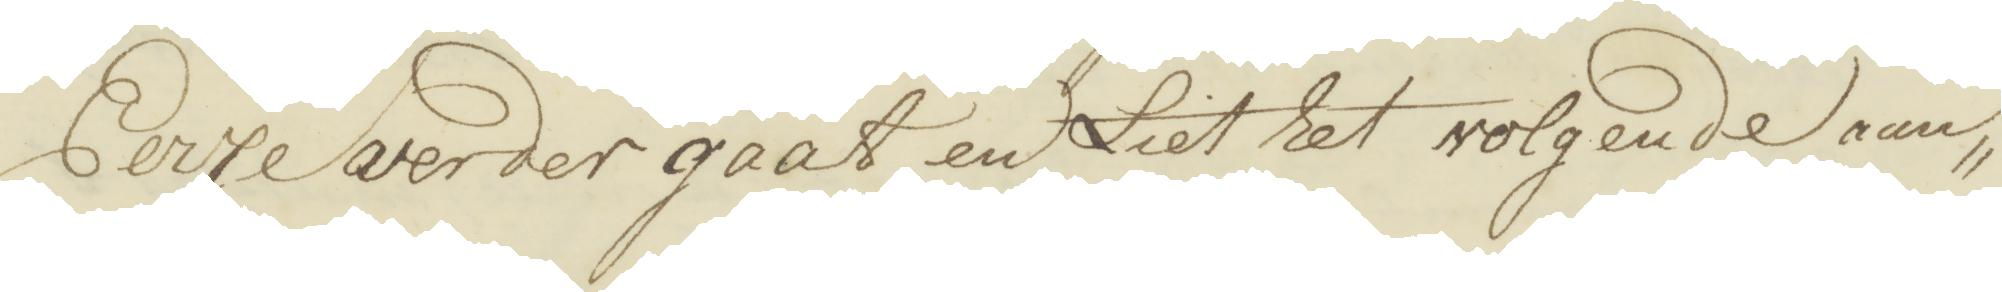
Eerje verder gaat en liet het volgende aan„
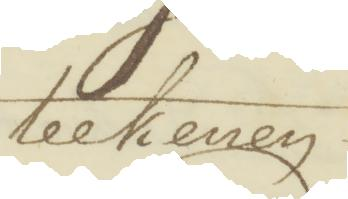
teekenen
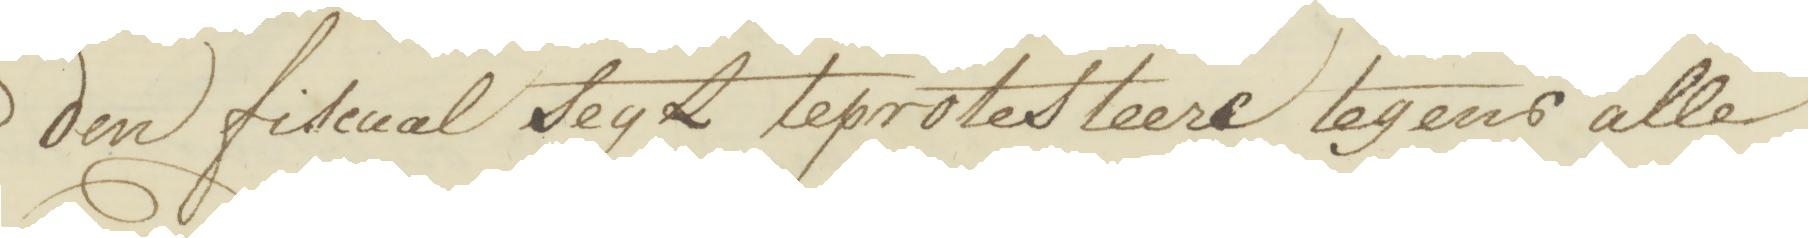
den fiscaal segt teprotesteere tegens alle
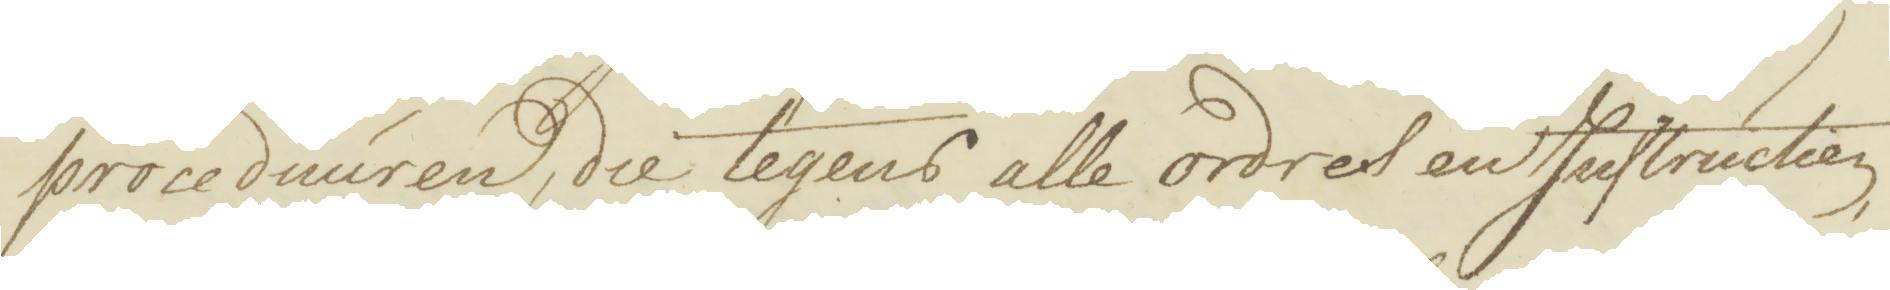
proceduuren, die tegens alle ordres en Jnstructien,
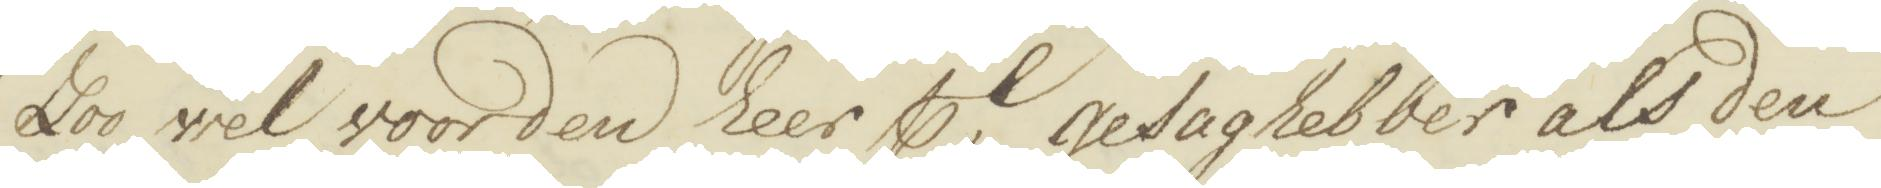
zoo wel voor den heer p:l gesaghebber als den
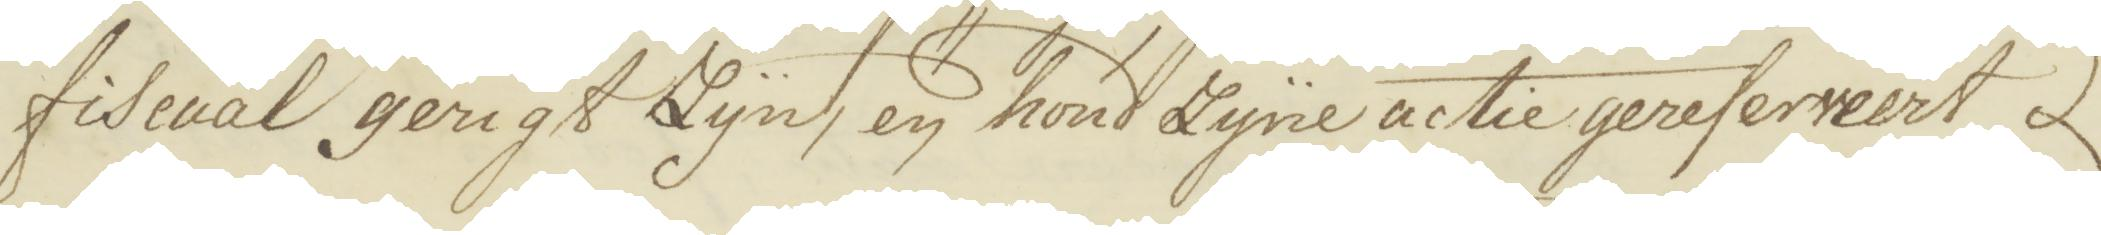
fiscaal gerigt zijn, en houd zijne actie gereserveert.
